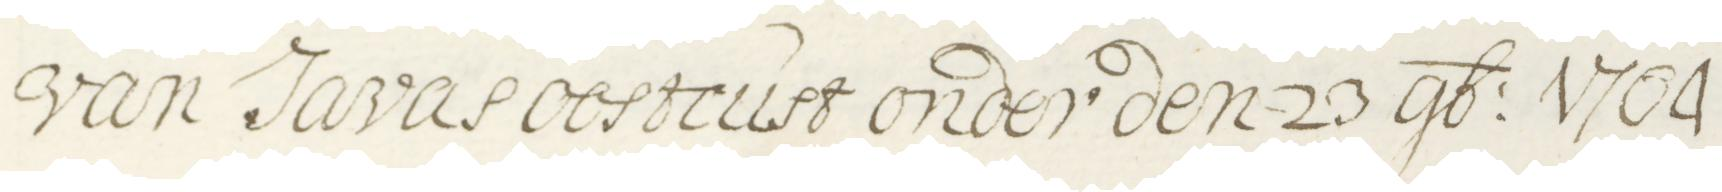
van Iavas oostcust onder den 23 9b: 1704
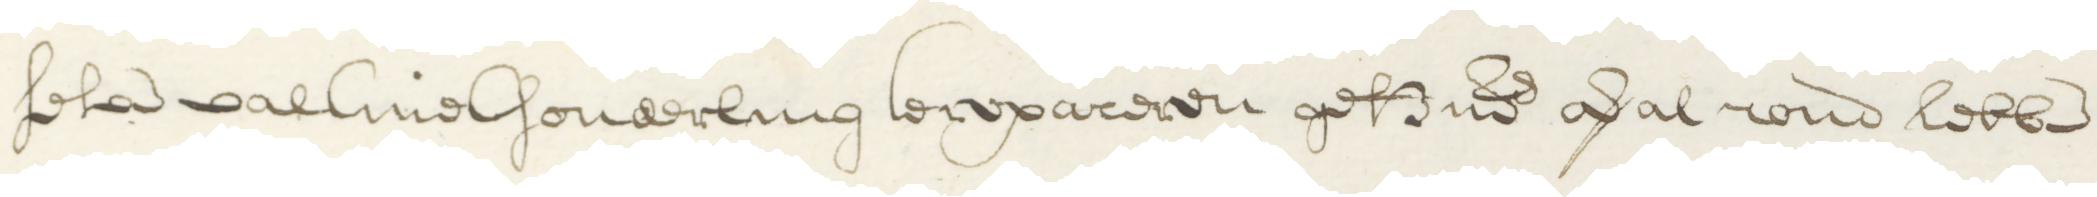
selve valt niet sonderling te repareren gelijk uEen overal rond hebbe
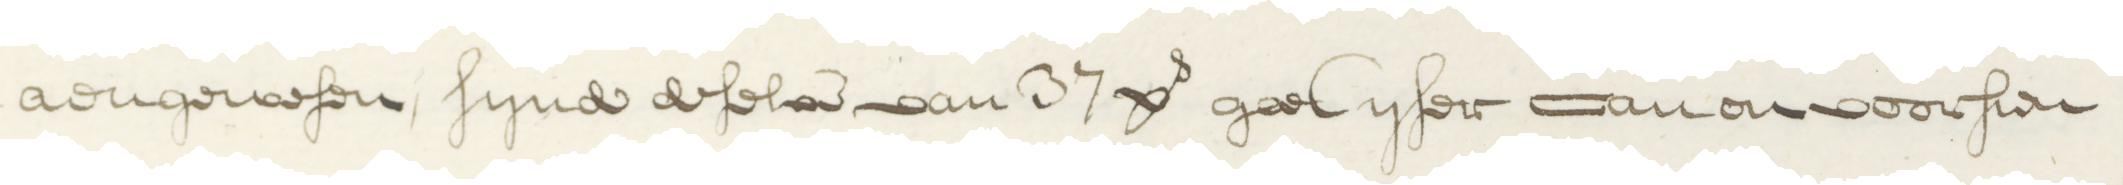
aengewesen, synde deselve van 37 ps goet yser canon voorsien
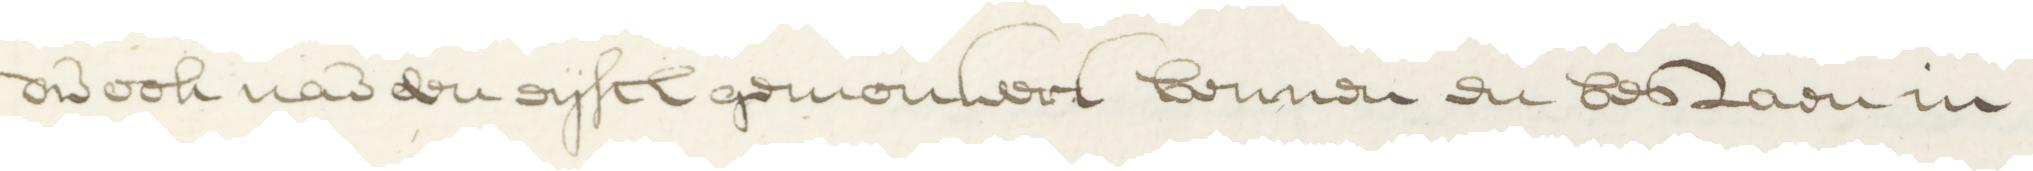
die ook nae den eijsch gemonteert bennen en bestaen in
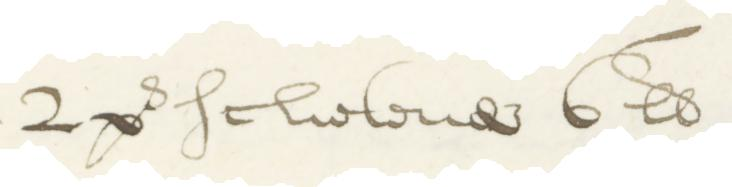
2 ps schietende 6 lb
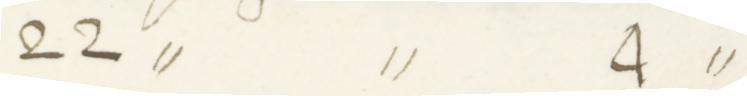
22 „ „ 4 „
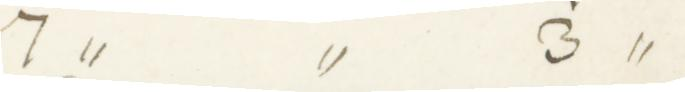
7 „ „ 3 „
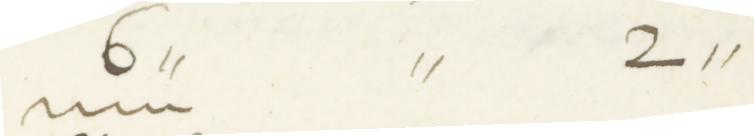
6 „ „ 2 „
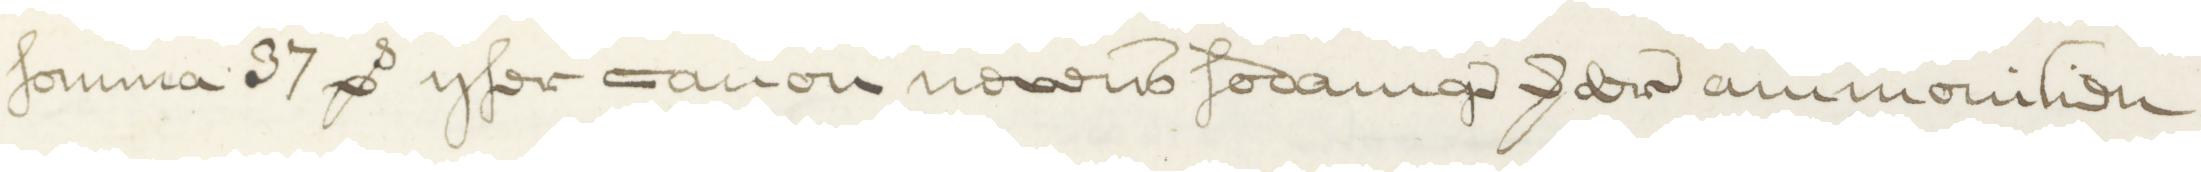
somma 37 ps yser canon nevens sodanige verder ammonitien
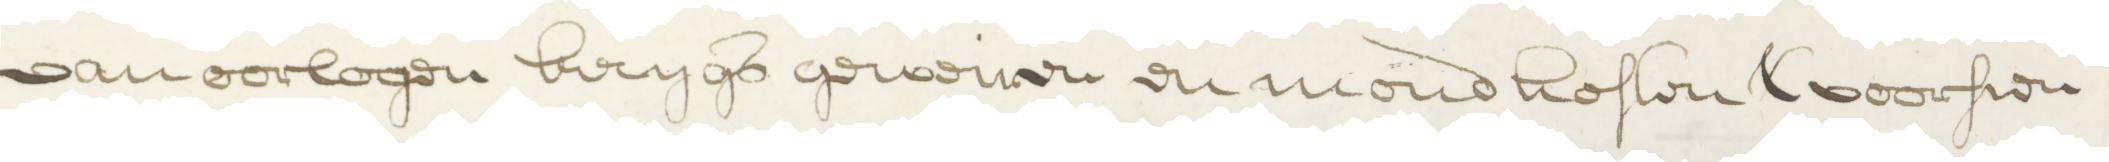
van oorlogen berijgd geweiren en mond kosten & voorsien
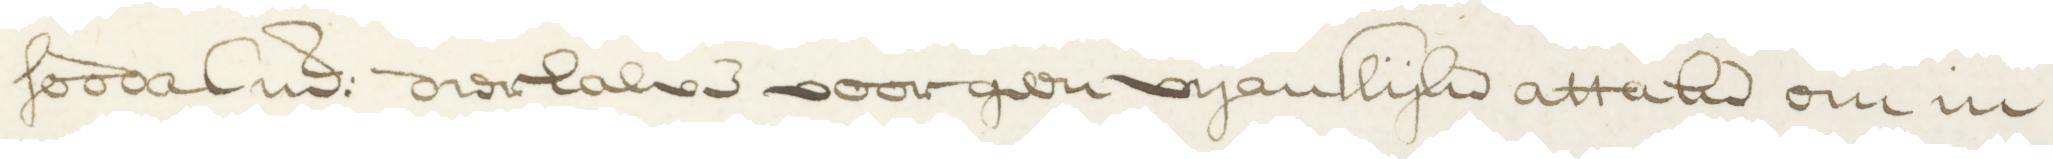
soodat uE: dierhalve voor geen vyantlijke attake om in
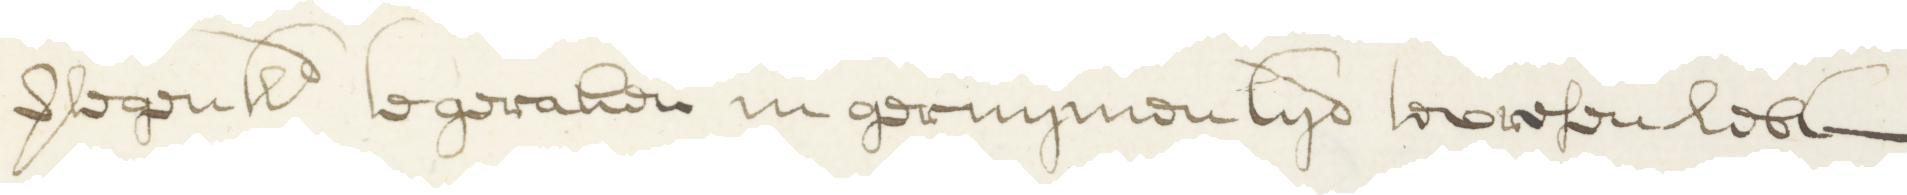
verlegenthd te geraken in geruymen tyd te vresen hebt —
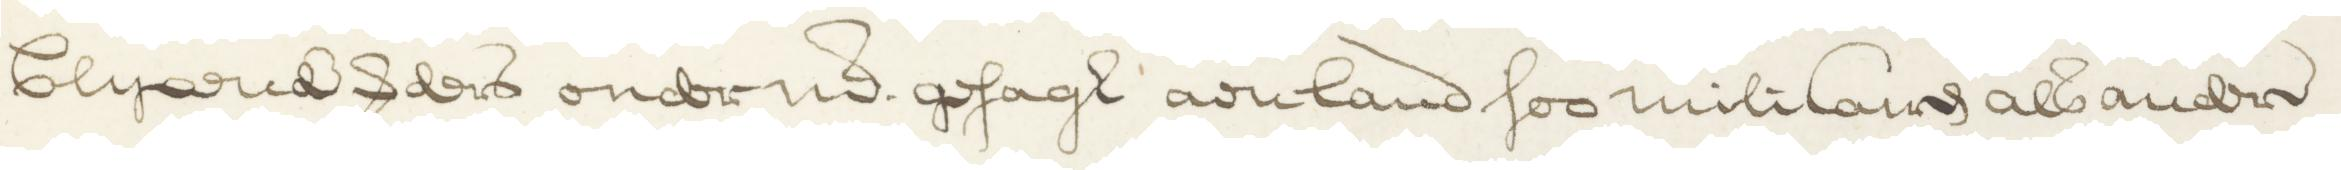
blijvende verders onder uE. gesagh aen land soo militairen als andere
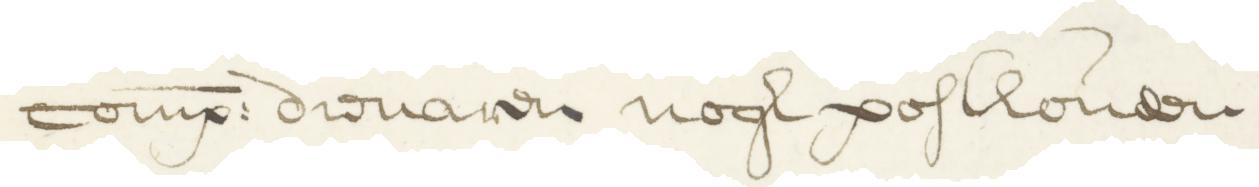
comp: dienaren nogh posthouden
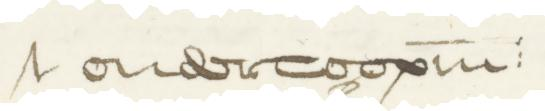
1 ondercoopm:
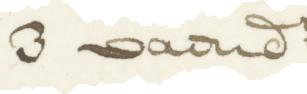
3 vaend
